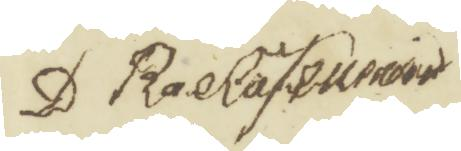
D Roelofswaard
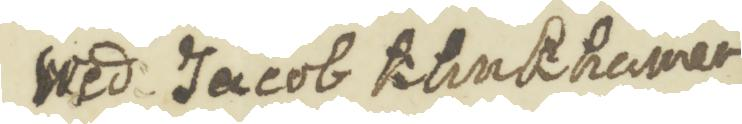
wed. Jacob klinkhamer
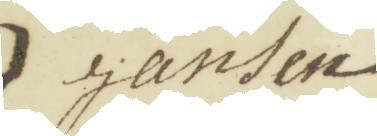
R jansen
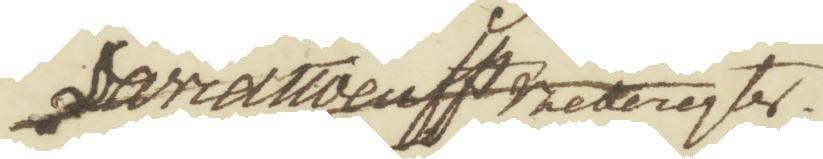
David toenfft vrederegter.
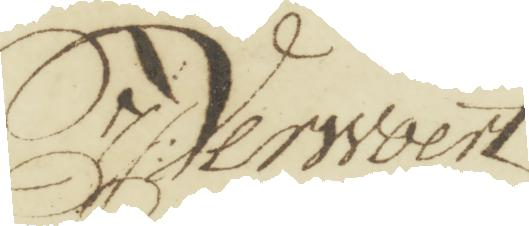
CJ Verwoert
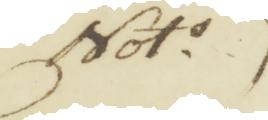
Not.s
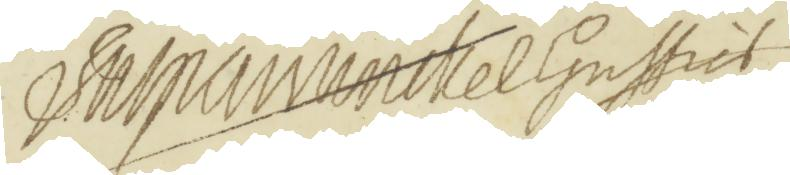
Herman winkel Griffier
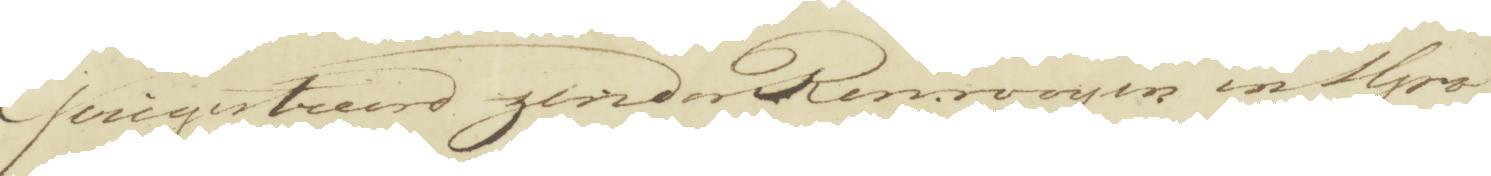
Geregistreerd zonder Renvooyen in sGra
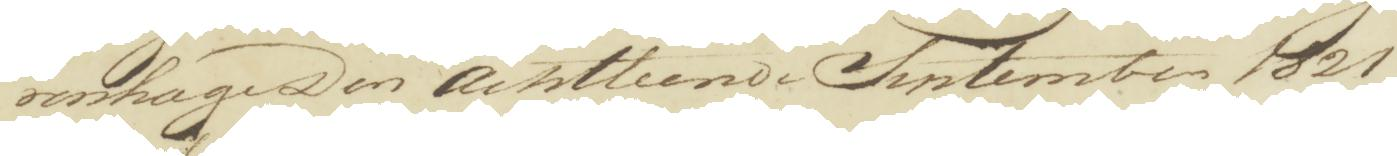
venhage Den achttiende September 1821
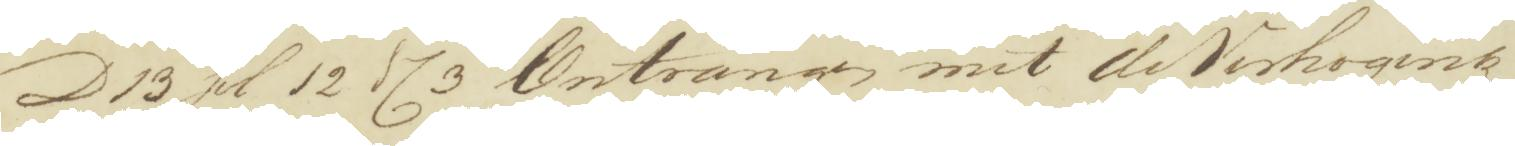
D13 fol 12 sC3 Ontvangen met de Verhoging
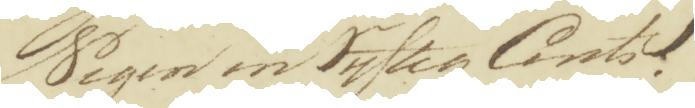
Negen en Vyftig Cents:
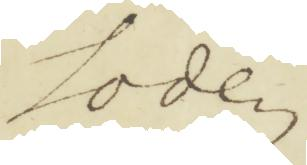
soden
